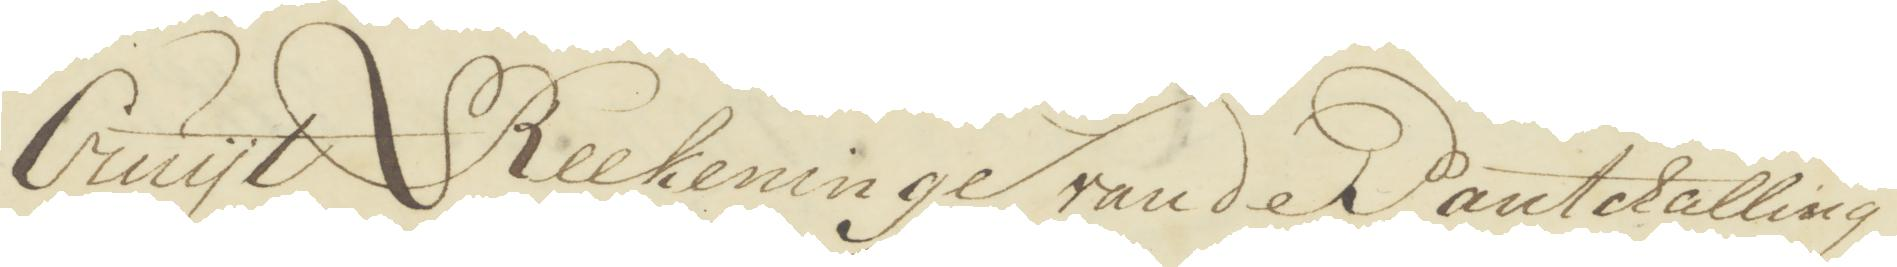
Cruijt Reekeninge van de Pantchalling
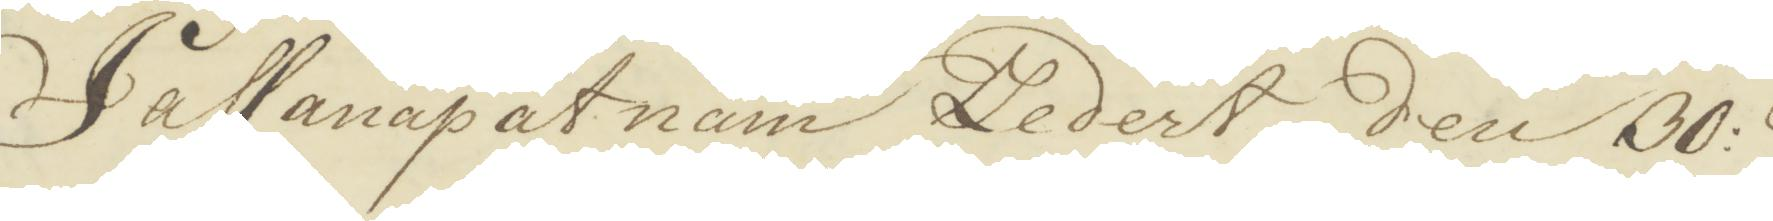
Jaffanapatnam zedert den 30:'
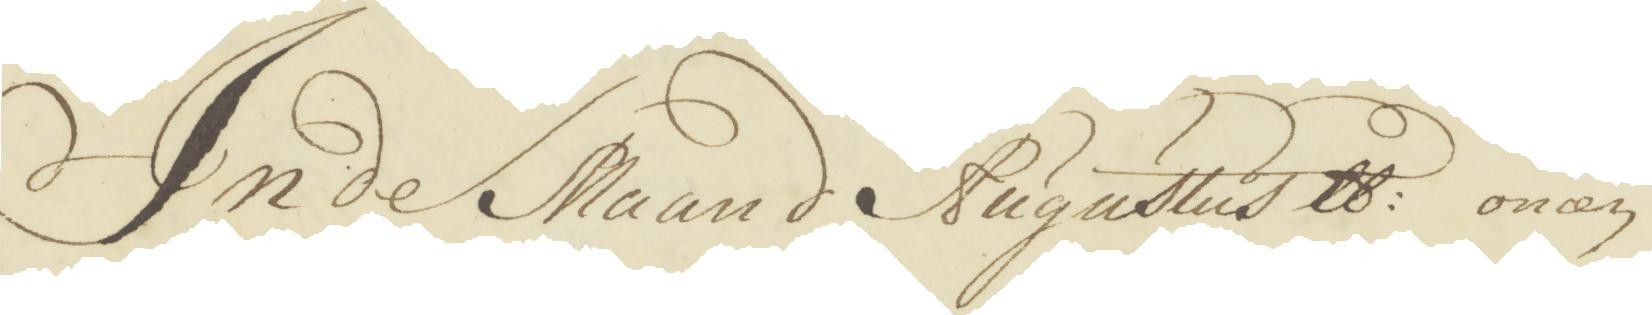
In de Maand Augustus lb: oncen
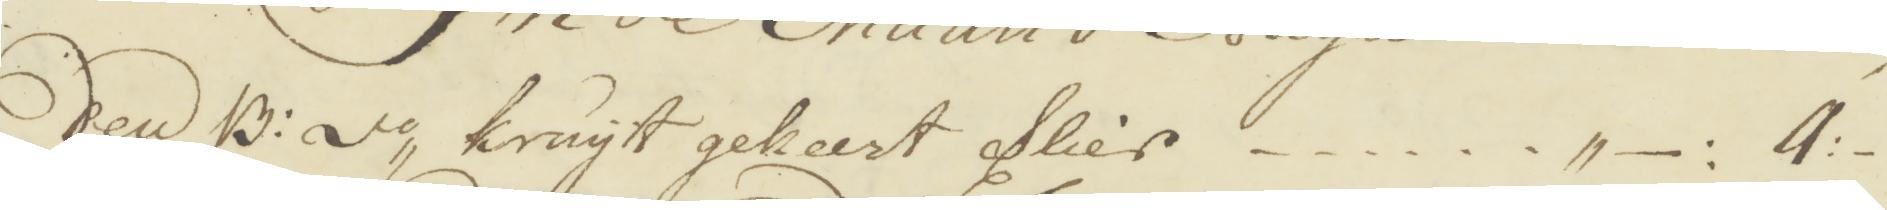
den 13: d„o kruijt gekeert verlies - - - - - - „—: 4:—
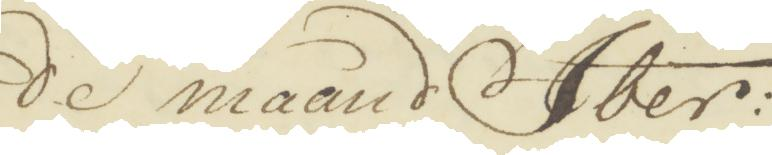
de maand Jber:
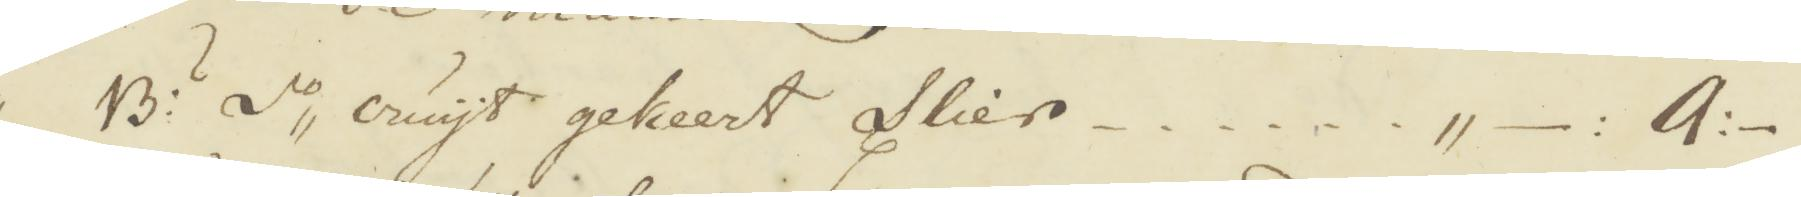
13:' d„o cruijt gekeert verlies - - - - - - „ —: 4:—
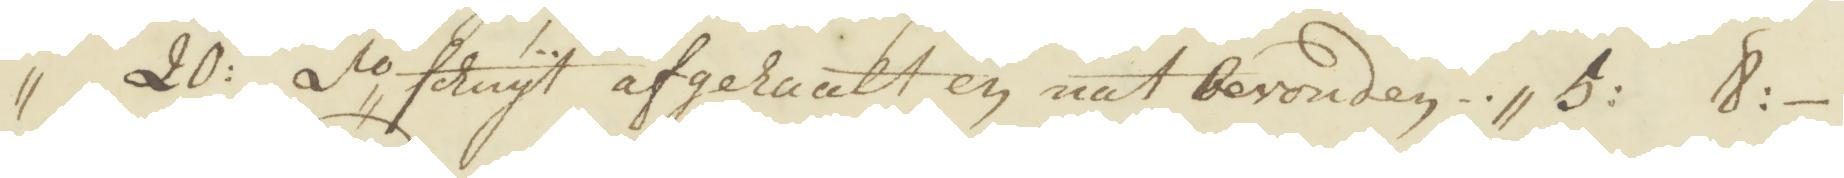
„ 20:' d„o schuijt afgehaalt en nat bevonden - - „ 5: 8:—.
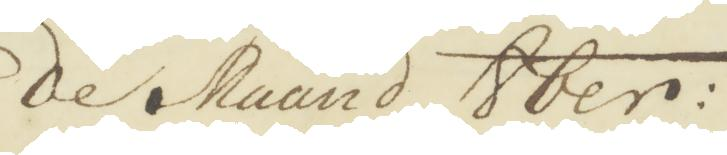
de Maand 8ber:
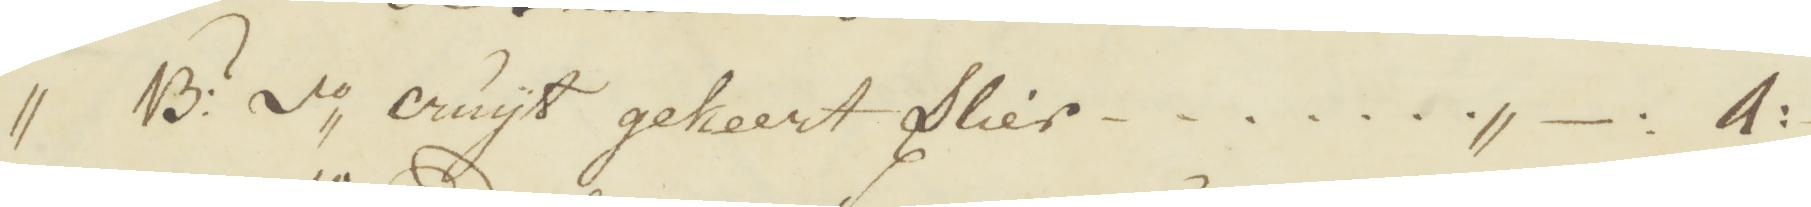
„ 13:' d„o cruijt gekeert verlies - - - - - - - „ —: 4:—
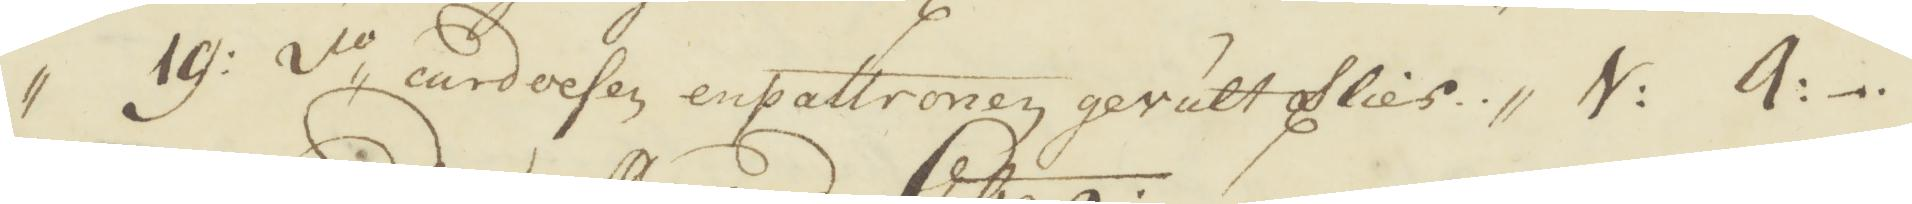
„ 19: d„o cardoesen en pattronen gevult verlies - - „ 1: 4:—.
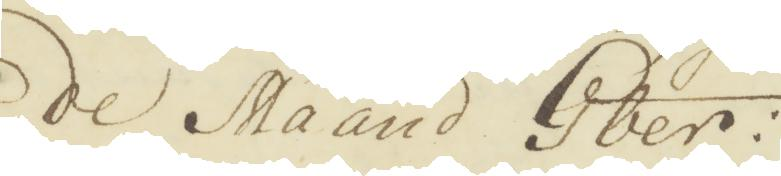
de Maand 9ber:
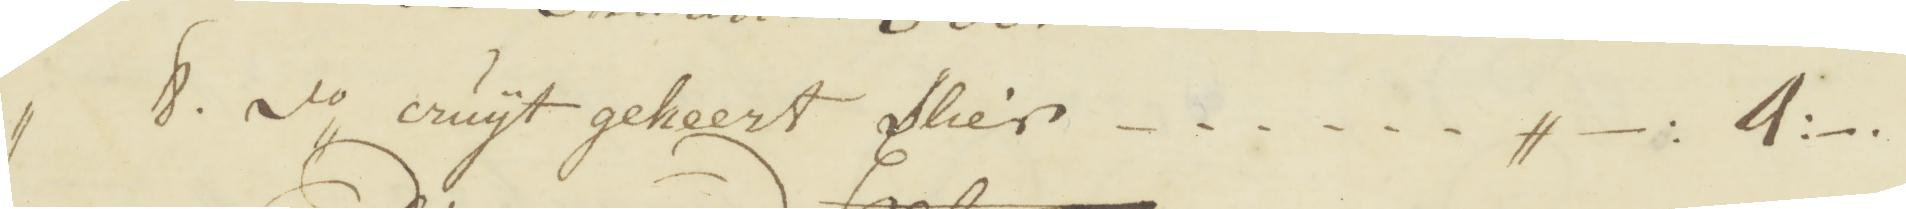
„ 8. d„o cruijt gekeert verlies - - - - - - „ —: 4:—.
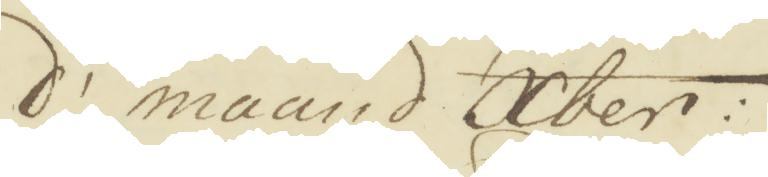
d’ maand Xber:
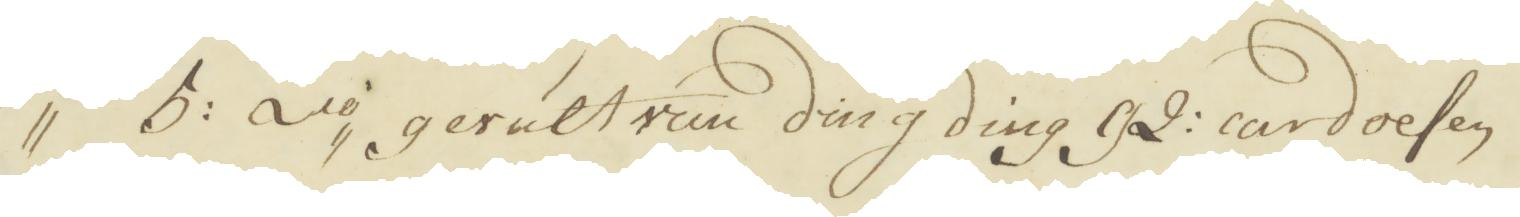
„ 5: d„o gevult van ding ding 92: cardoesen
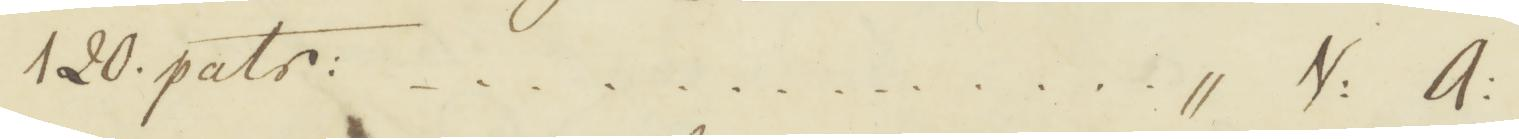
120. patr: - - - - - - - - - - - - - - „ 1: 4:
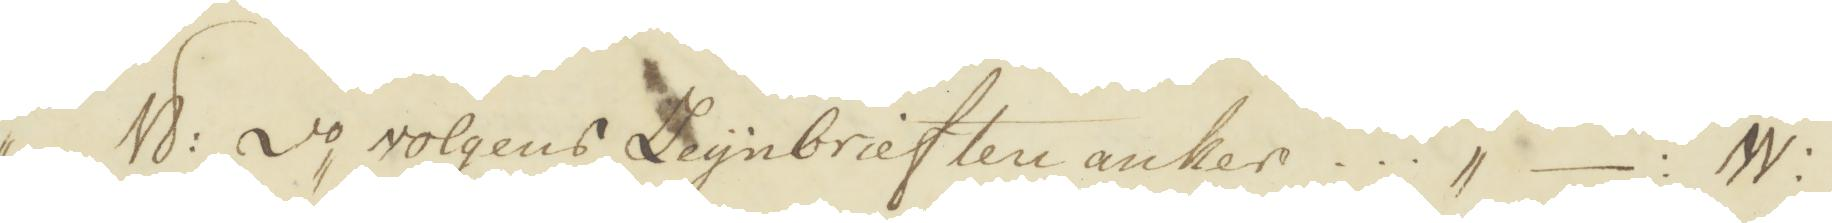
„ 18: d„o volgens Zeijnbrief ten anker - - - „ —: 11:
